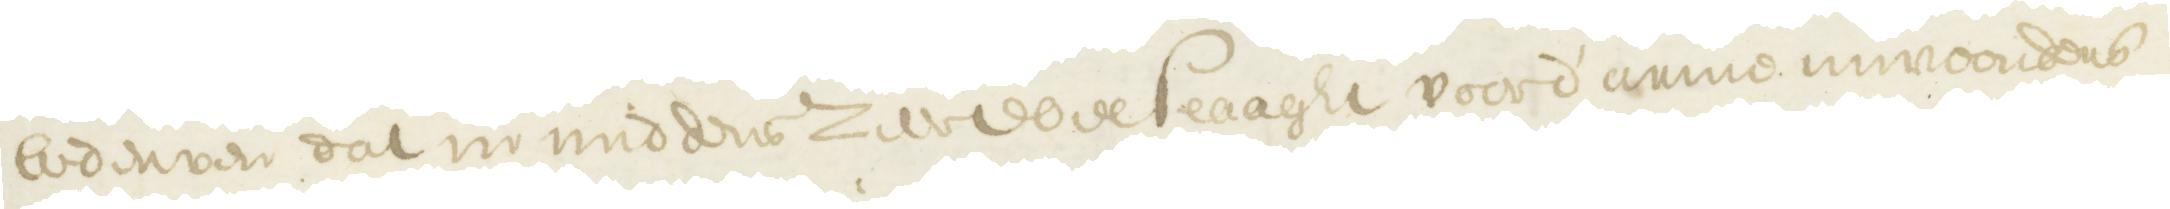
bederven dat in middens zeer wel slaaght voor d’ arme inwoonders
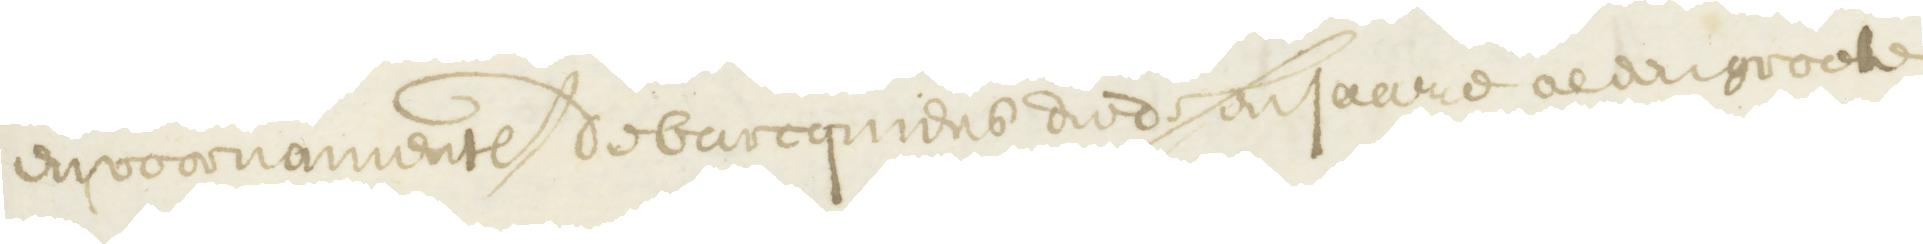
en voornamentlijk de barcquiers die desen jaare alden groote
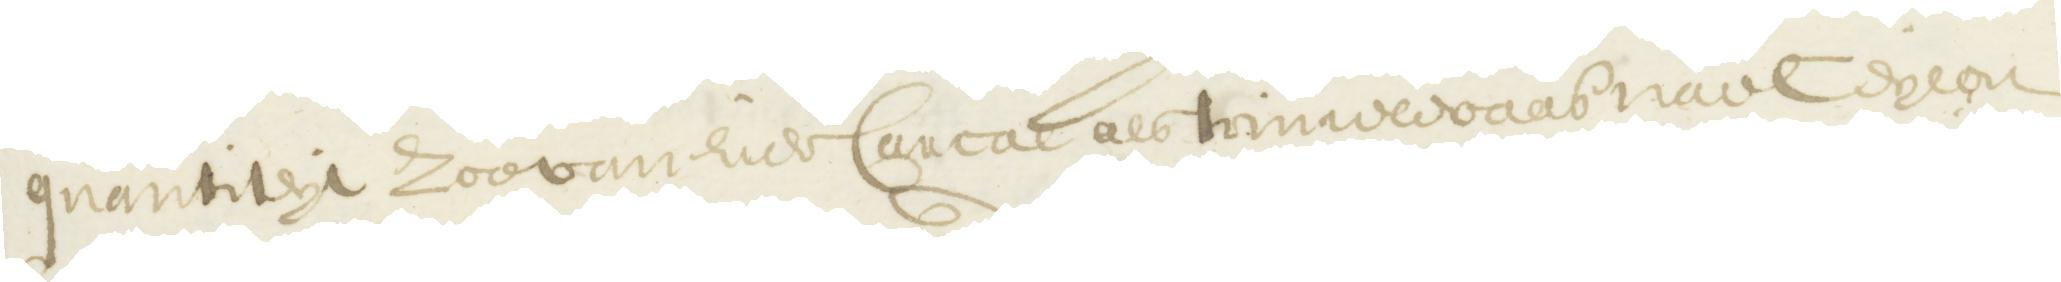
quantiteijt zoo van hier Carcal als trimelevaas nae Ceijlon
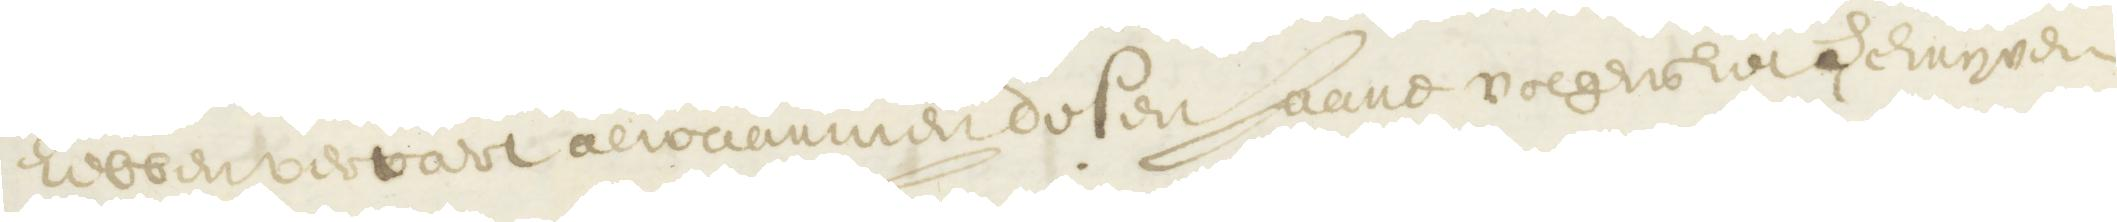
hebben vervoert alwaarmen desen Jaare volgens het schrijven
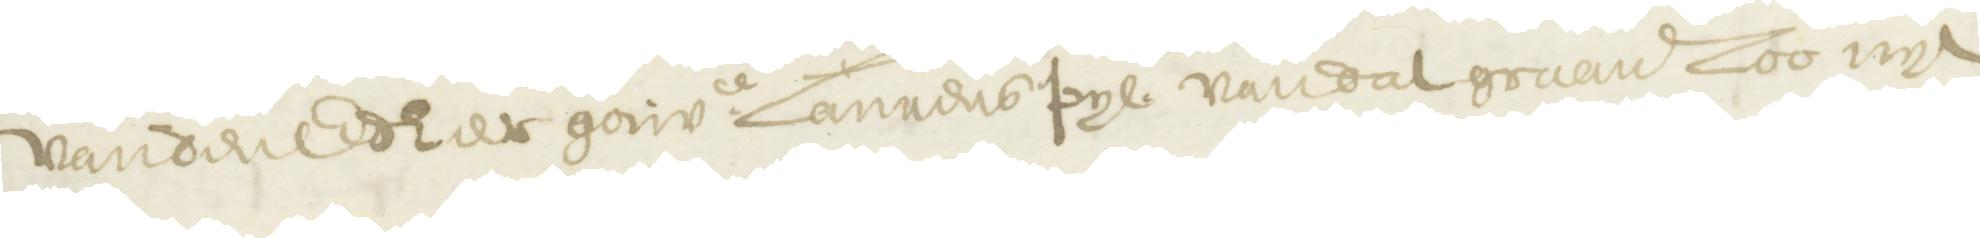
van den Edheer gouv:r Laurens pijl van dat graan zoo uijt
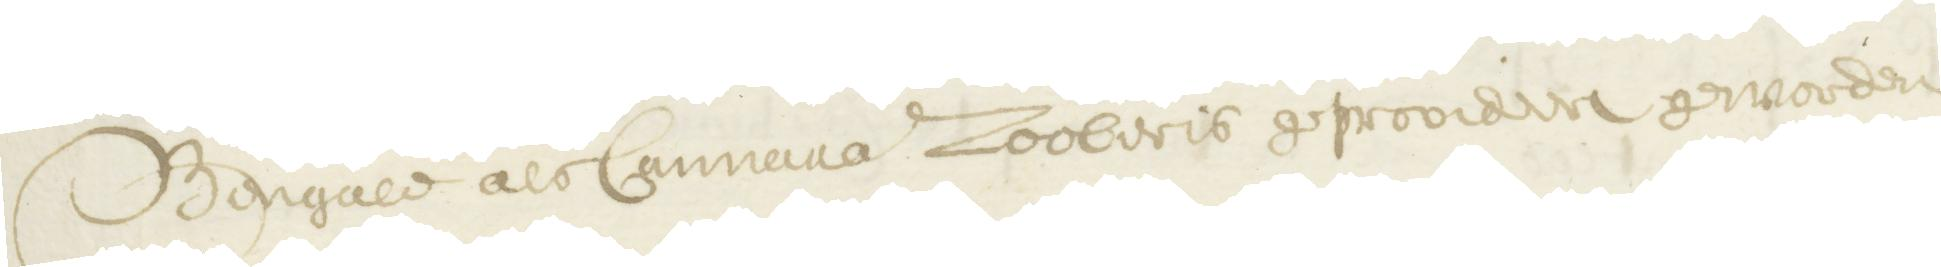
Bengale als Cannara zoober is geprovideert geworden
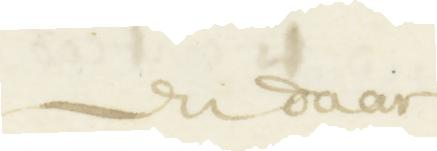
en daar
